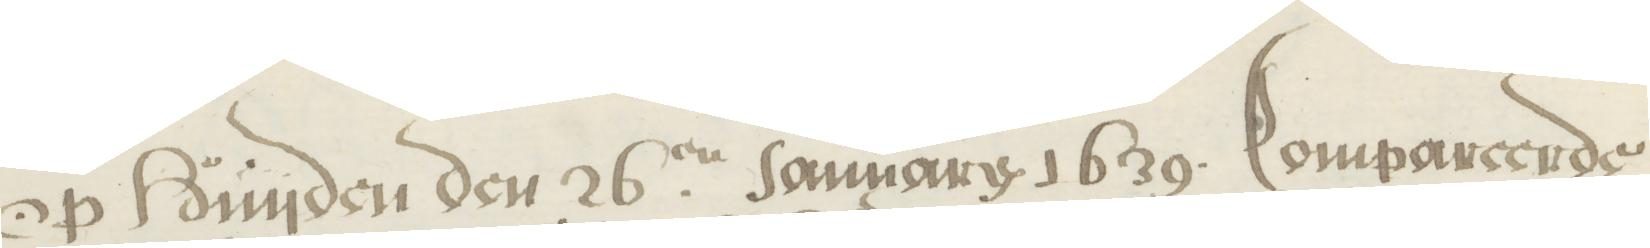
Op huijden den 26.n Ianuarij 1639. Compareerde
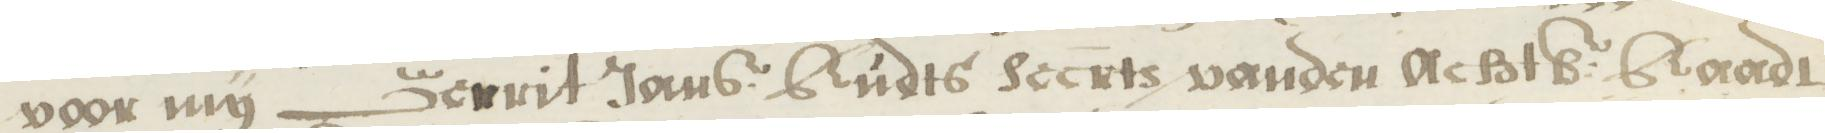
voor mij Gerrit Jans.n Rudts secrts van den Achtb:n Raadt
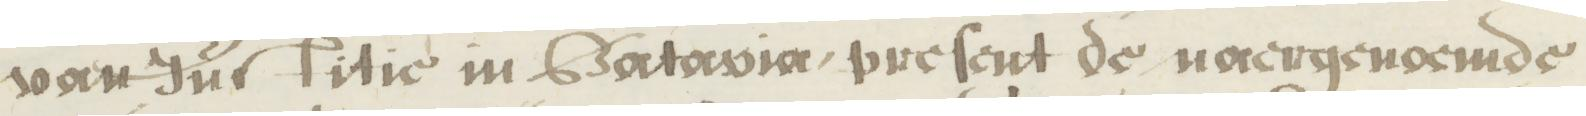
van Iustitie in Batavia present de naergenoemde
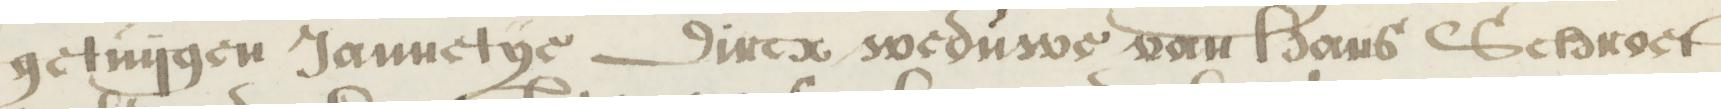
getuijgen Iannetije dircx weduwe van hans schroeff
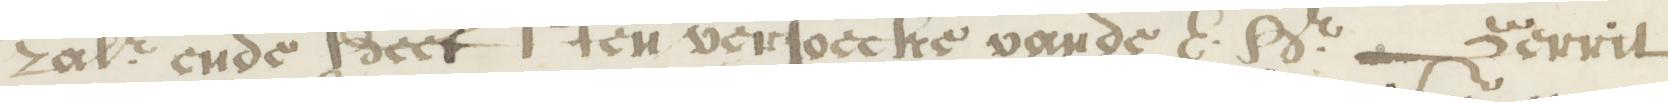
zal.r ende heefst ten versoecke van de E. h.r Gerrit
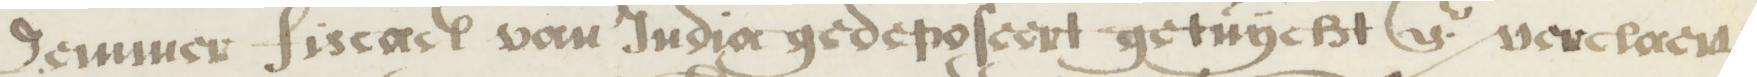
demmer fiscael van India gedeposeert getuijcht ende verclaert
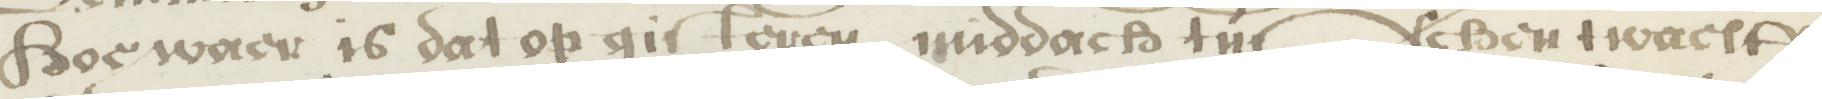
hoe waer is dat op gisteren middach tusschen twaelff
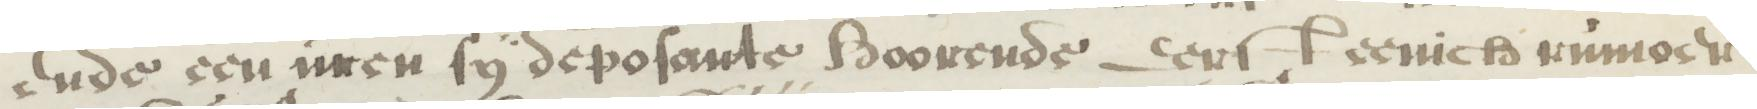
ende een uren sij deposante hoorende Eerst eenich rumoer
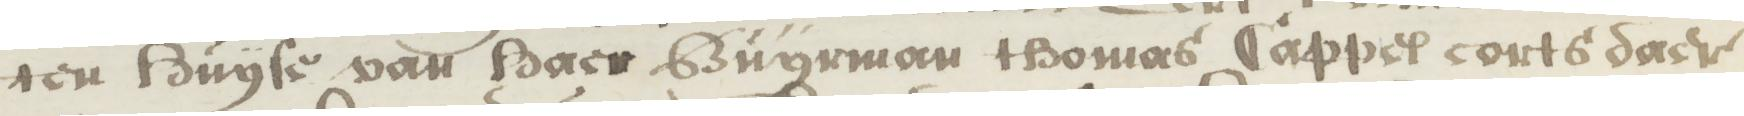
ten huijse van haer Buijrman thomas Cappel corts daer
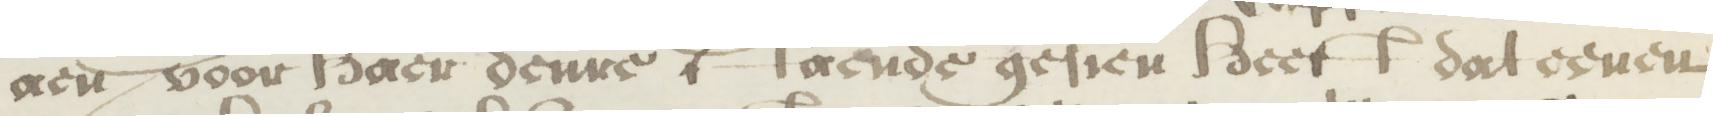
aen voor haer deure staende gesien heeft dat eenen
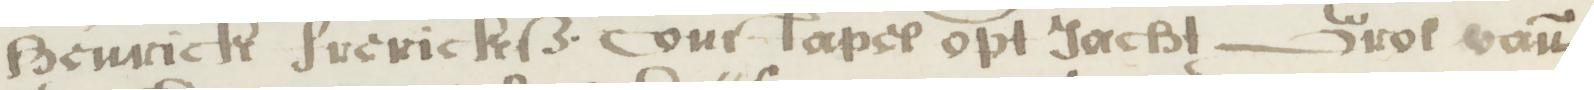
henrick frericksz. constapel opt Iacht Grot van
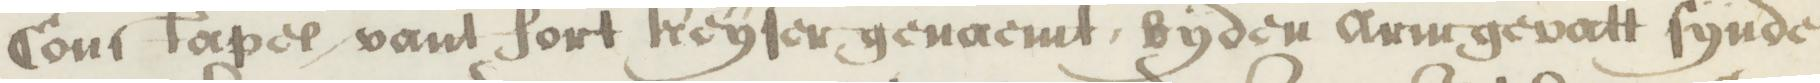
Constapel vant fort keijser genaemt, bij den armgevatt sijnde
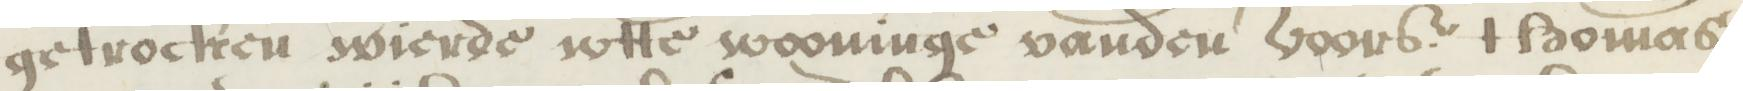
getrocken wierde wtte wooninge vanden voors.n thomas
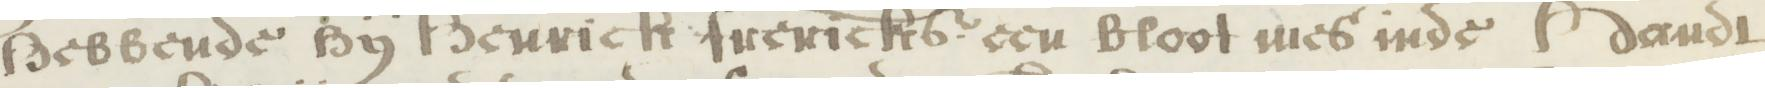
hebbende hij henrick frerick.n een bloot mes inde handt
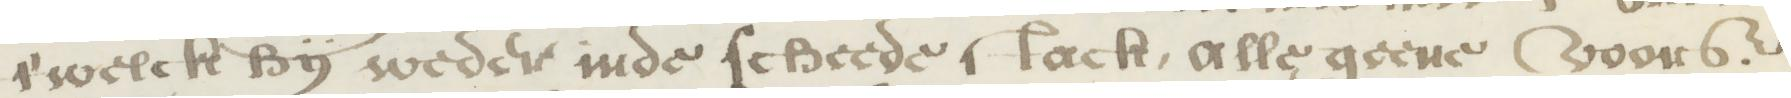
t'welck hij weder inde scheede stack, alle geene voors.n
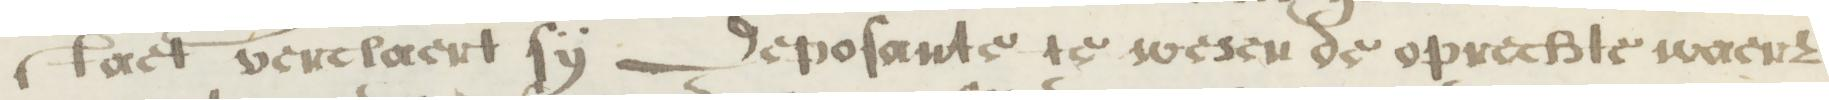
staet verclaert sij deposante te wesen de oprechte waerh
